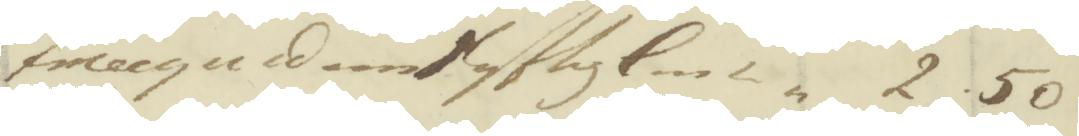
twee guldens Vyftig Cent „ 2. 50
